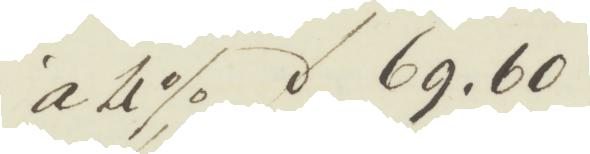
a 4% ƒ 69.60
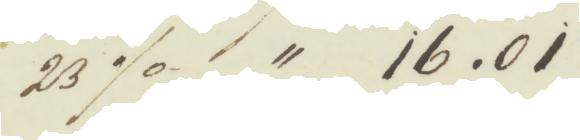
23% „ 16.01
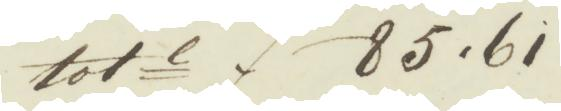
tot=l ƒ 85.61
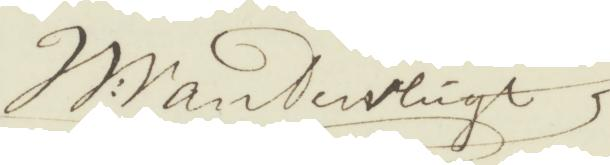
W: van der Vlugt
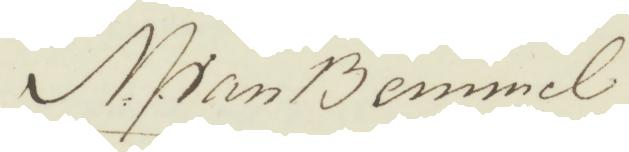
N:J. van Bemmel
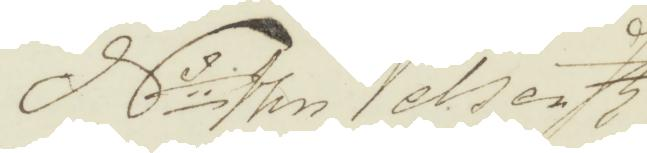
N=s van Velsen J=z
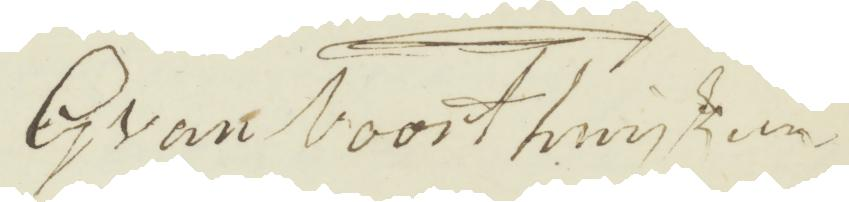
G van Voorthuijzen
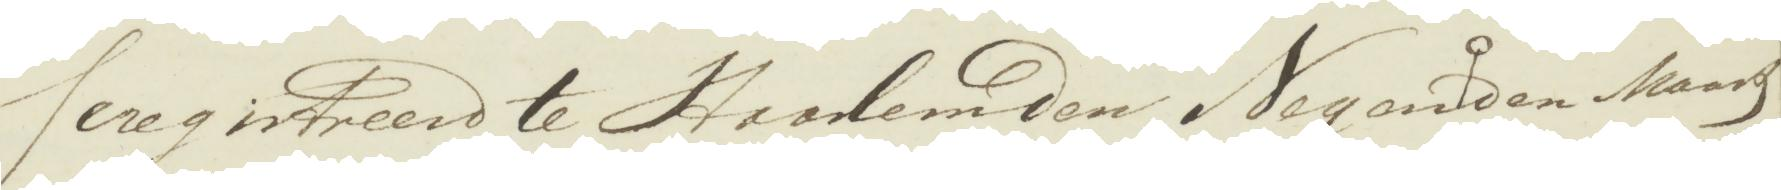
Geregistreerd te Haarlem den Negen¶den Maart
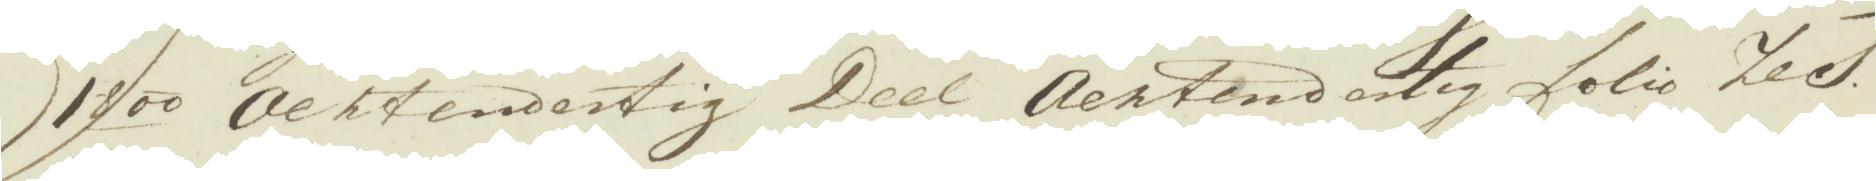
1800 Achtendertig Deel achtendertig folio Zes.
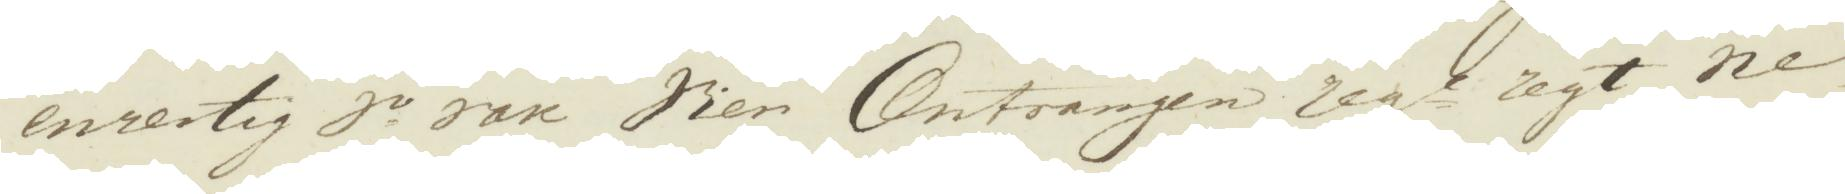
enzestig V:o van Vier Ontvangen reg=l regt ne
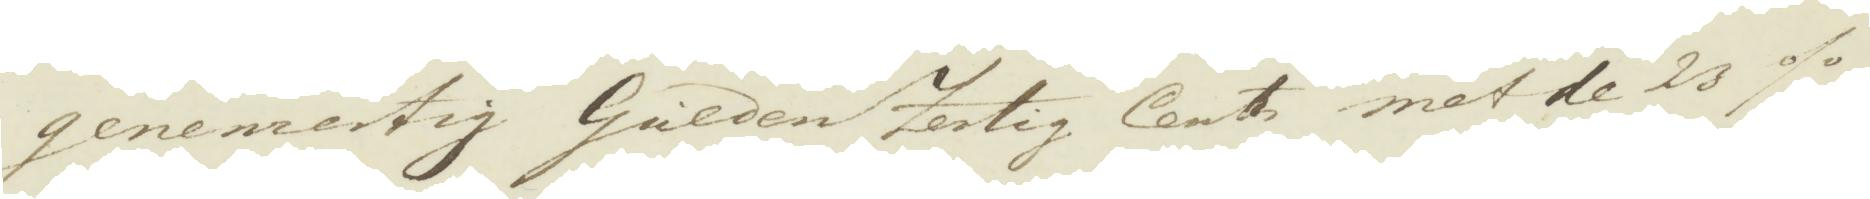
genenzestig Gulden Zestig Cents met de 23%
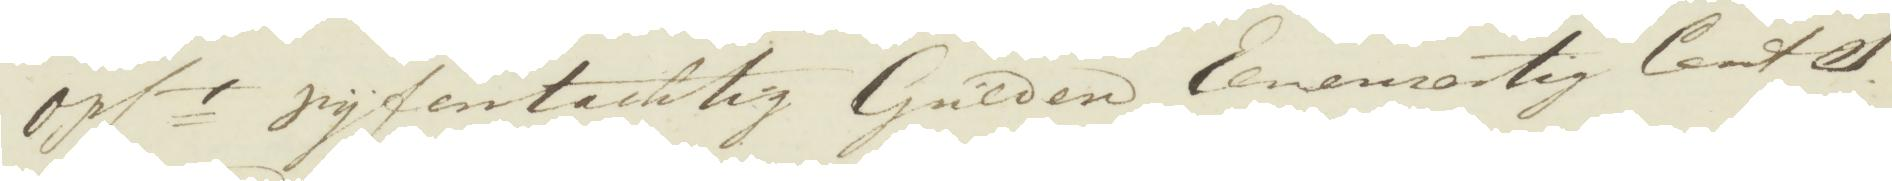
OpC=t vijfentachtig Gulden Eenenzestig Cents.
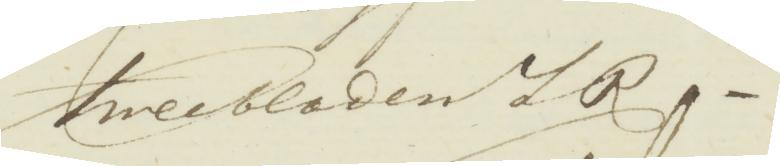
tweebladen ZR –
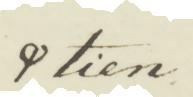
¶ tien
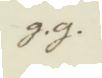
g.g.
